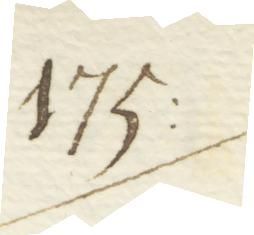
175:
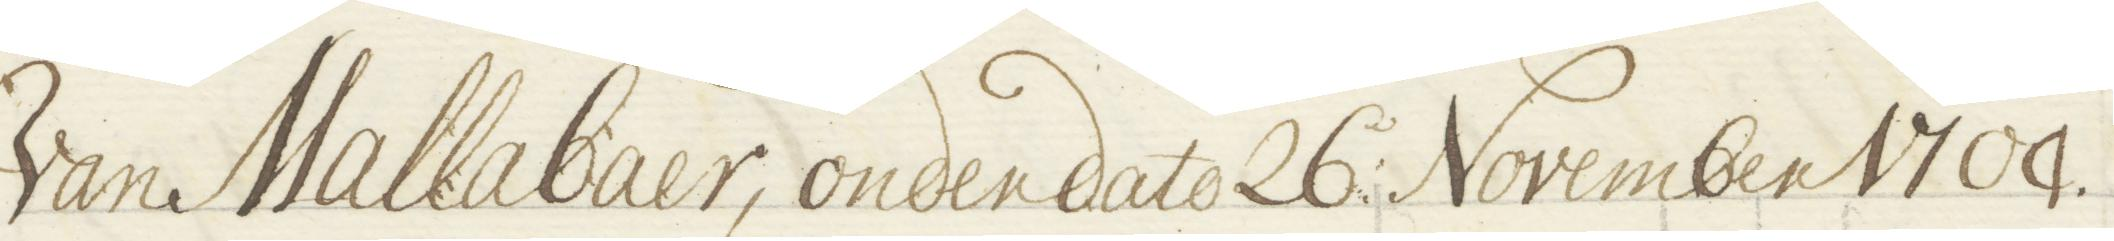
Van Mallabaer, onder dato 26:' November 1704.
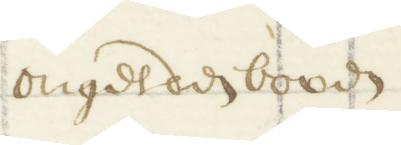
ongelden boven
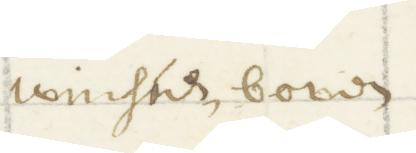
winsten boven
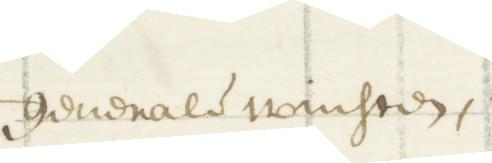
generale winsten,
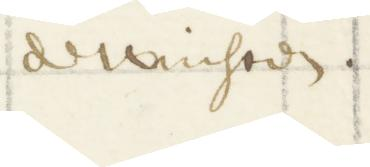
de winsten.
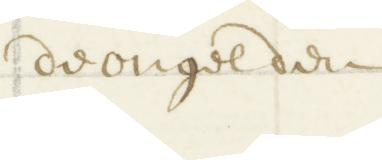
de ongelden
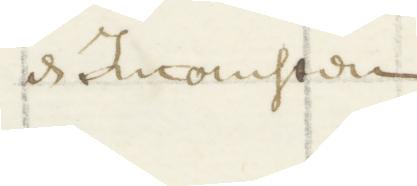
en Incomsten
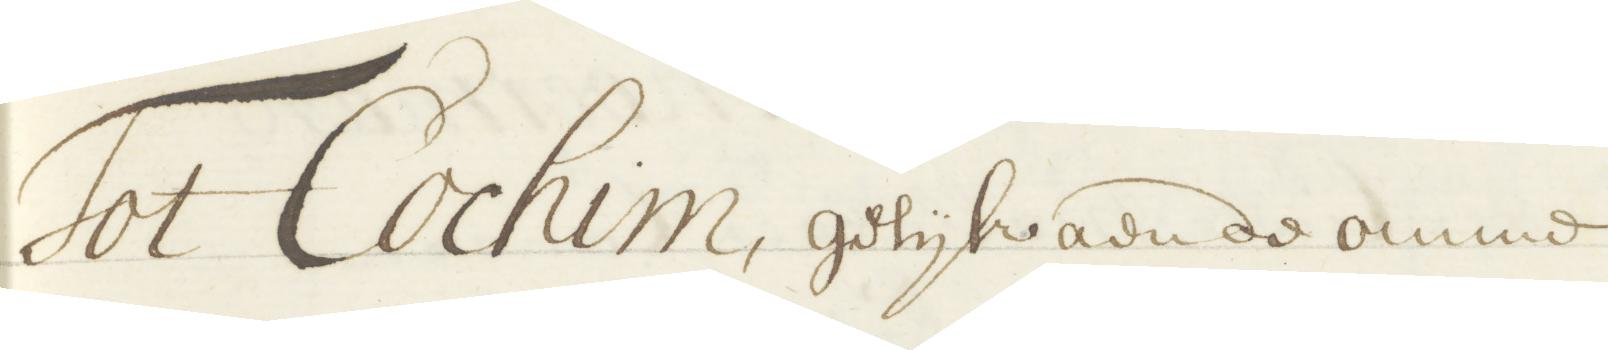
Tot Cochim gelijk aen de omme
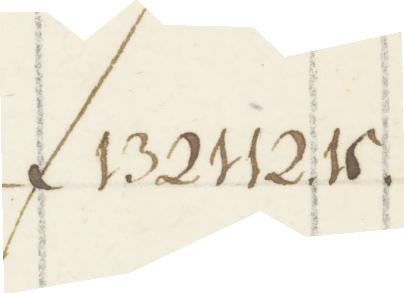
ƒ132112.15.
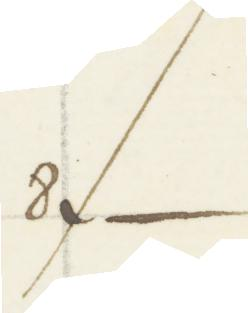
8 ƒ—
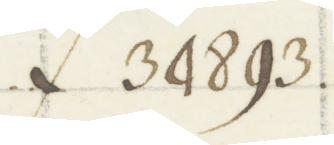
ƒ 34893.
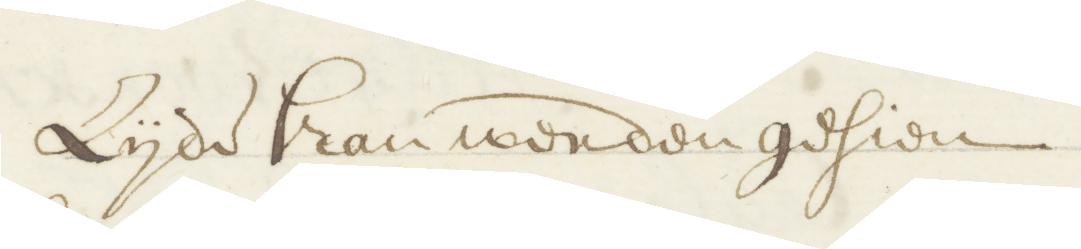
Zijde kan werden gesien
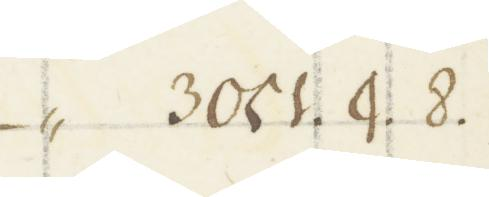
-„ 3051.4.8.
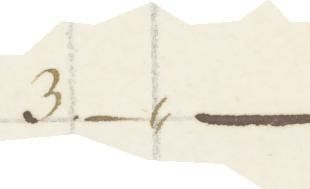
3. —„—
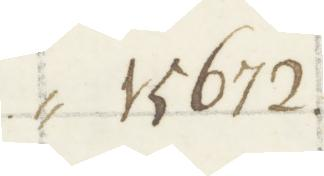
„ 15672
